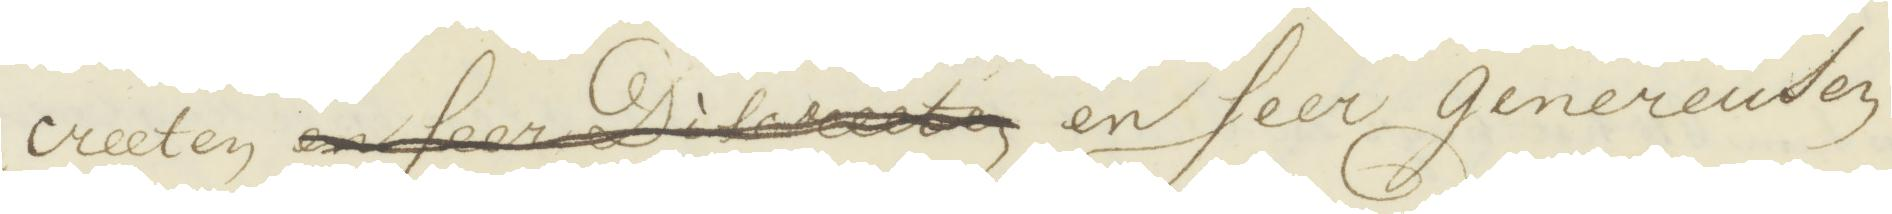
creeten en seer Discreeten en seer genereusen
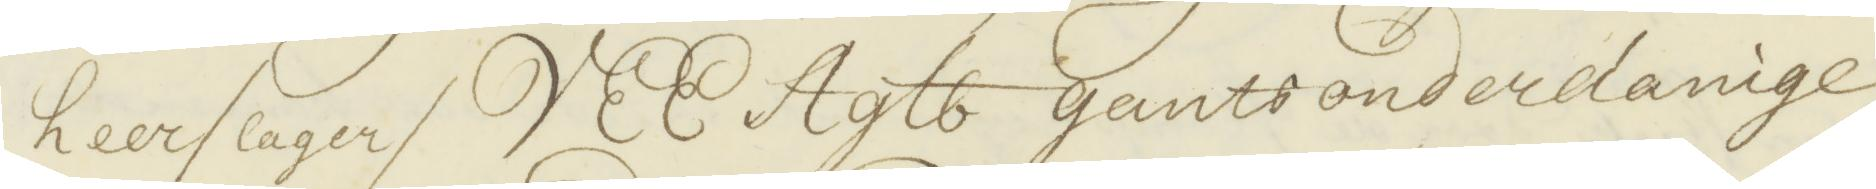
heer / lager / VEE Agtb gants onderdanige
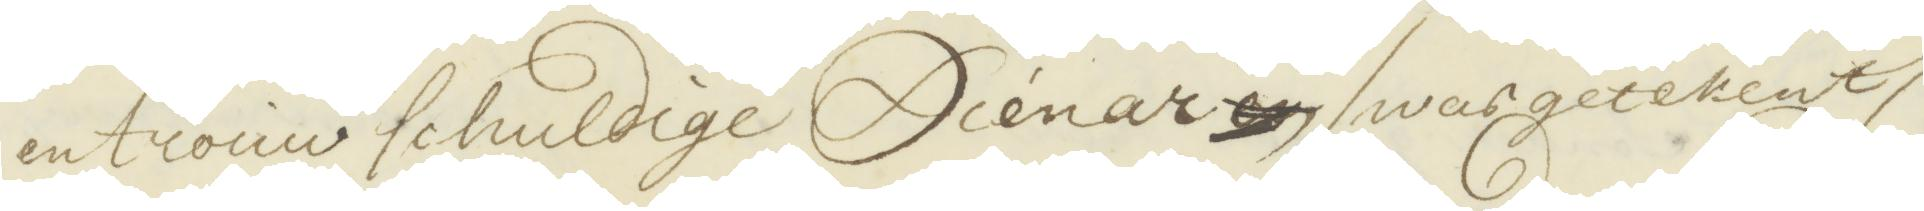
en trouw schuldige Dienaren / was getekent /
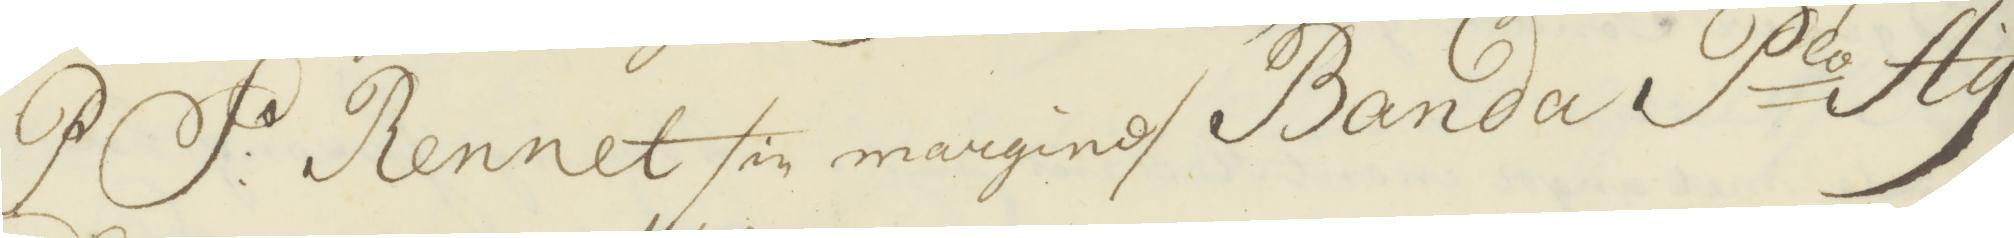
P S: Rennet / in margine / Banda P=lo Hij
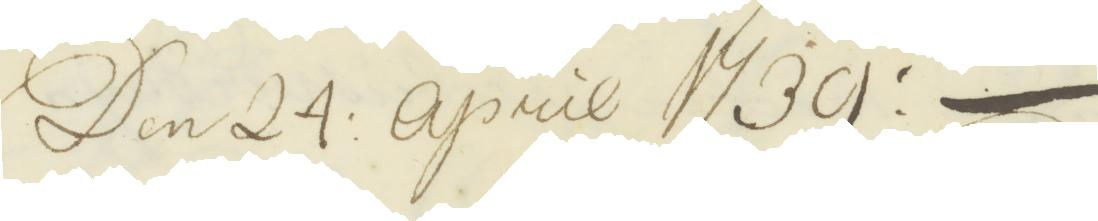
Den 24: april 1739: —
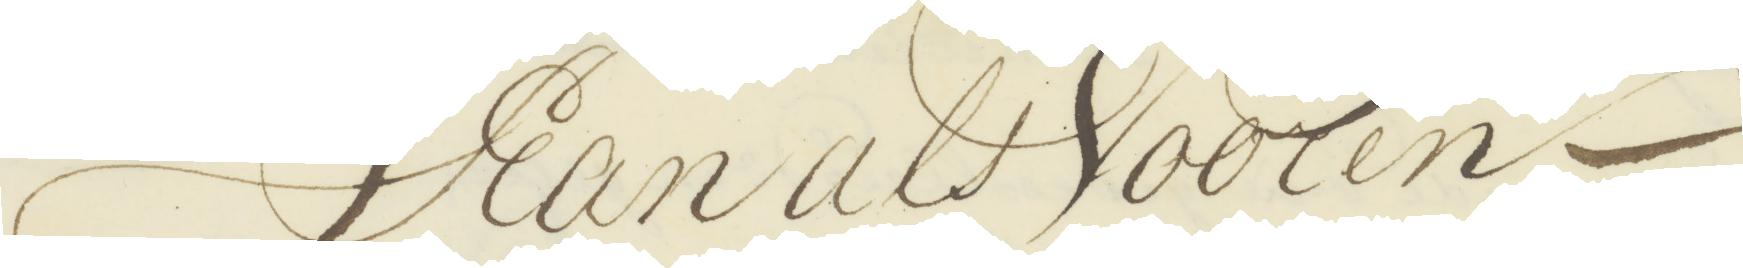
Aan als Vooren —
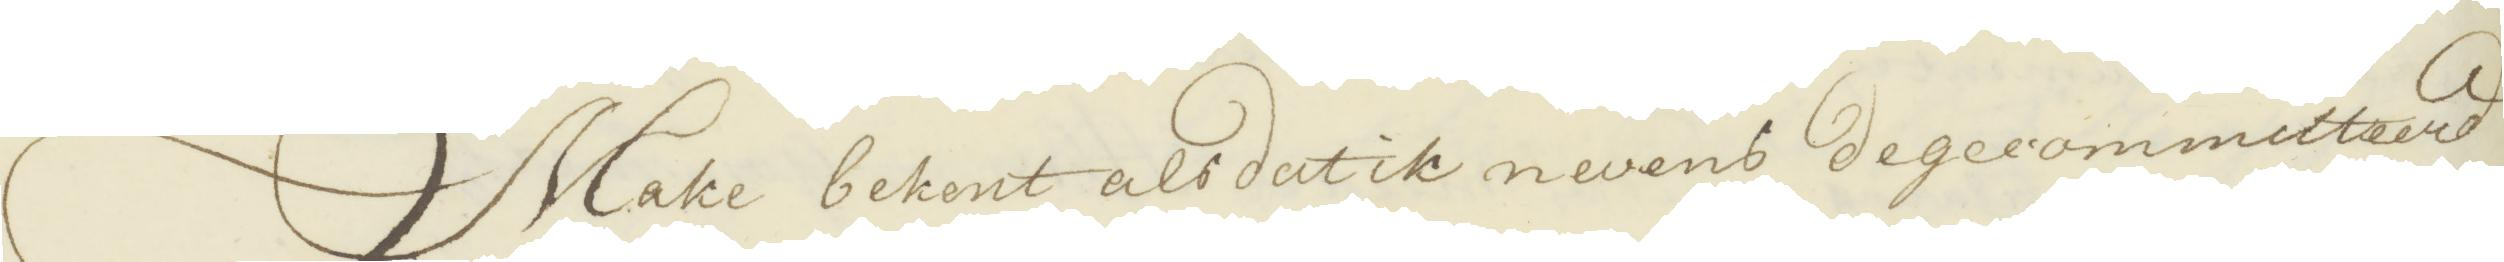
Make bekent als dat ik nevens de gecommitteerd
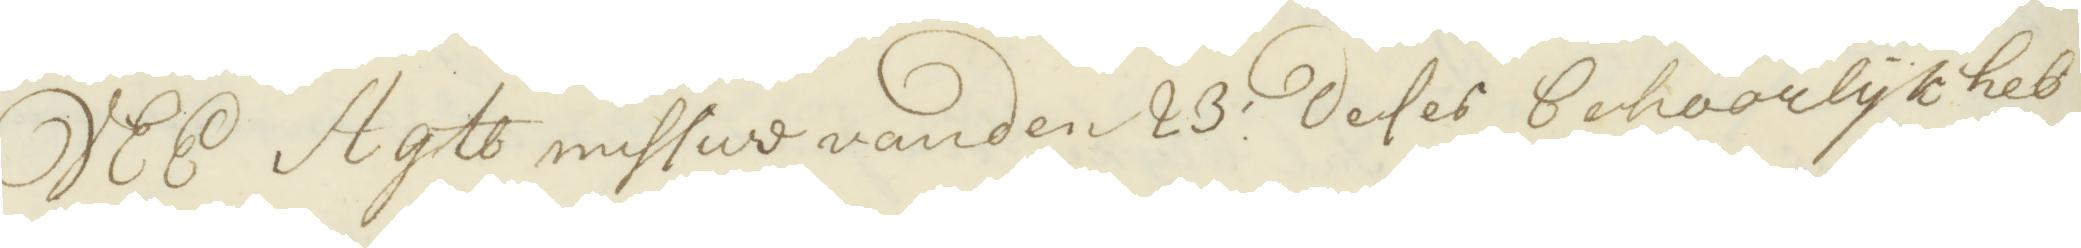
VEE Agtb missive van den 23: deses behoorlijk heb
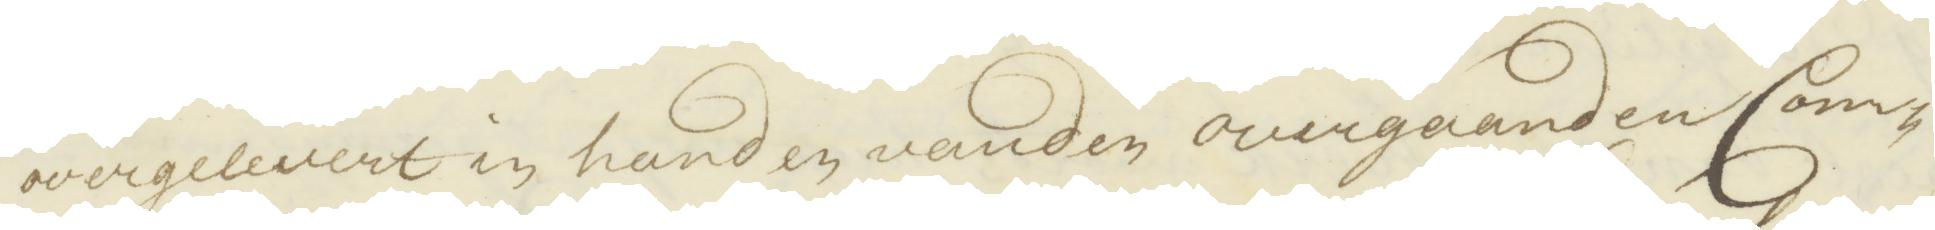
overgelevert in handen vanden overgaanden Com„
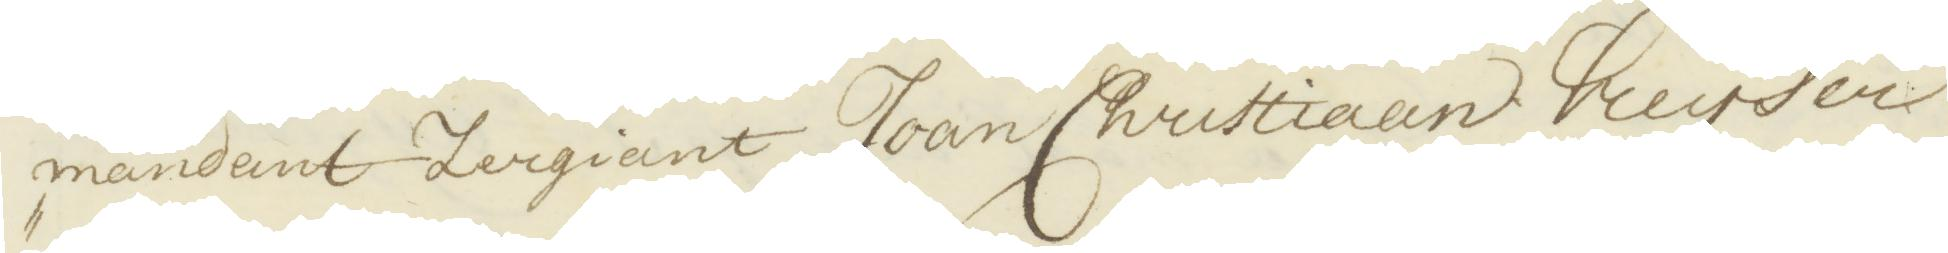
„mandant Zergiant Joan Christiaan Keyser
